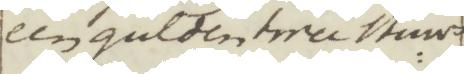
een gulden twee stuivs
